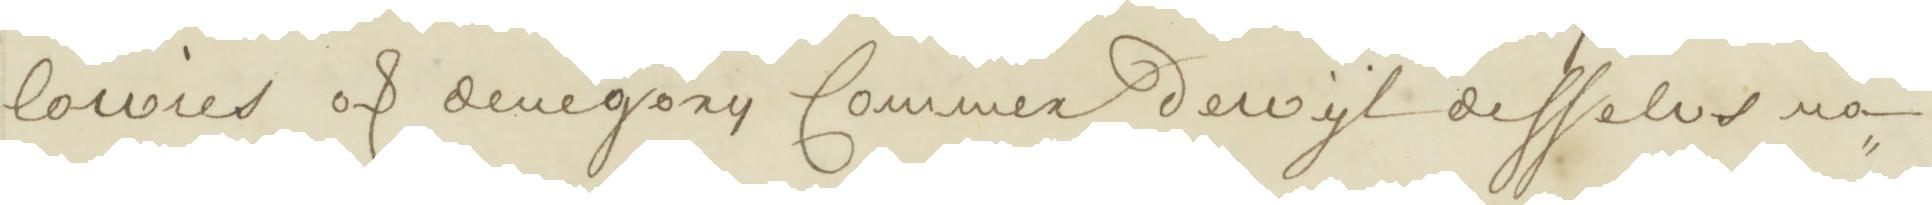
lowies over de negorij Commer, dewijl desselvs na„
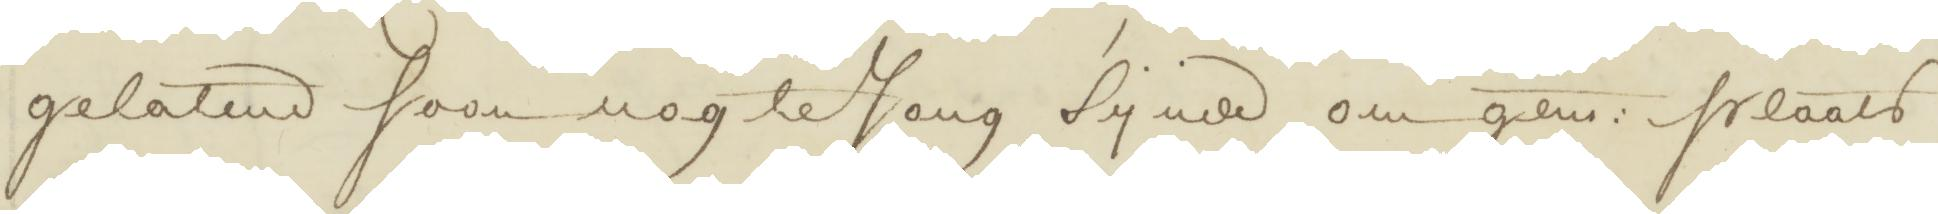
gelatene Soon nog te Jong Sijnde om gem: plaats
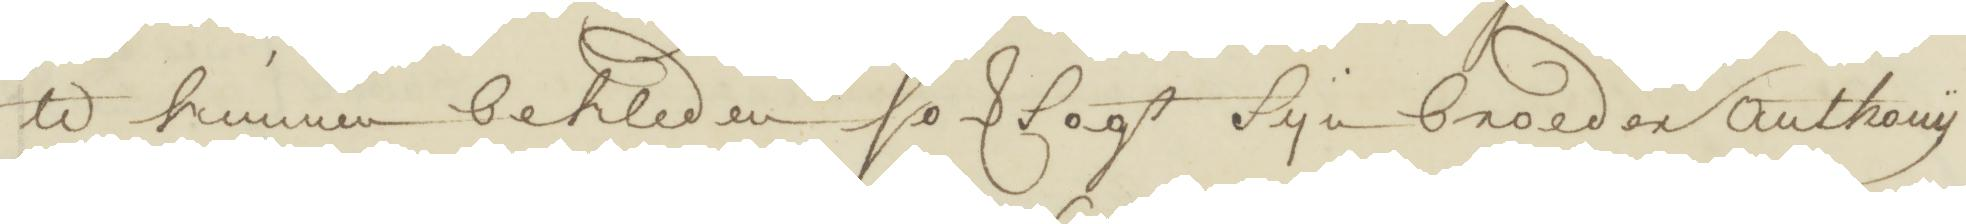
te kunnen bekleden, So versogt sijn broeder Anthonij
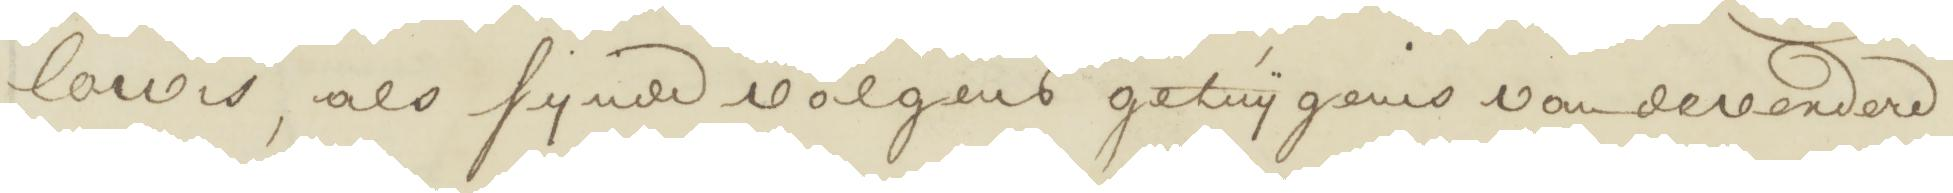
lowis, als Sijnde volgens getuijgens van de verdere
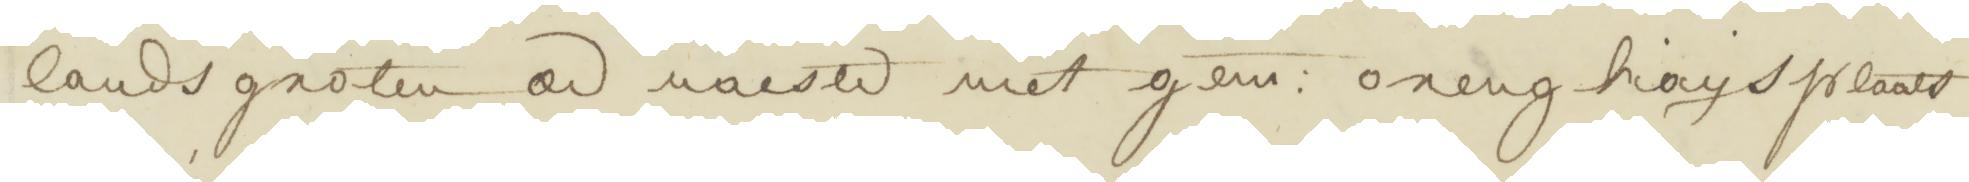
lands groten, de naeste met gem: orengkaijs plaats
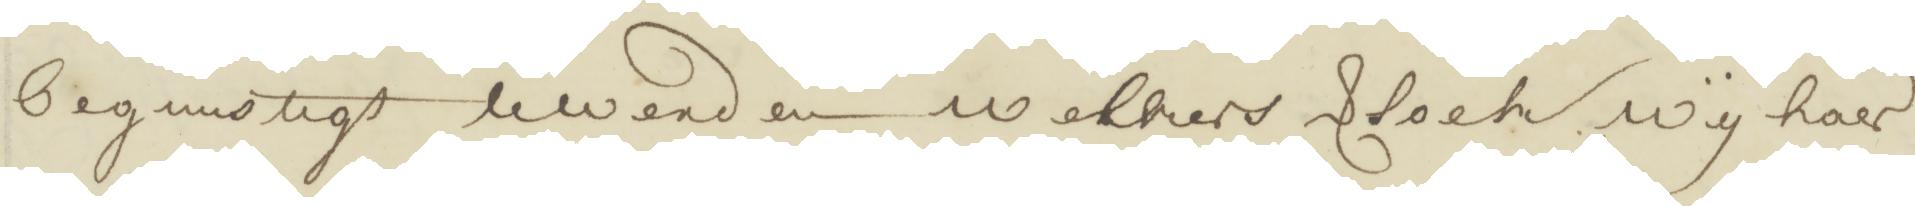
begunstigt te werden welkers versoek wij haer
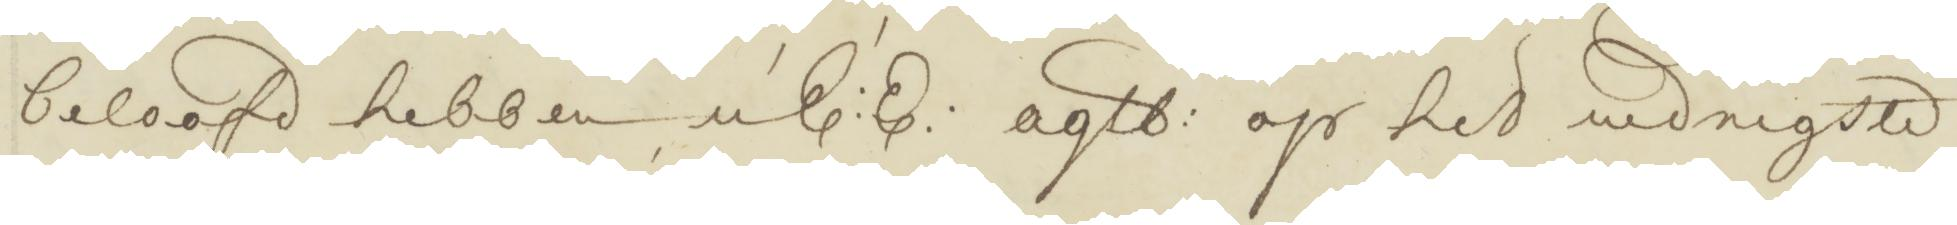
beloofd hebben, uE: E: agtb: op het nedrigste
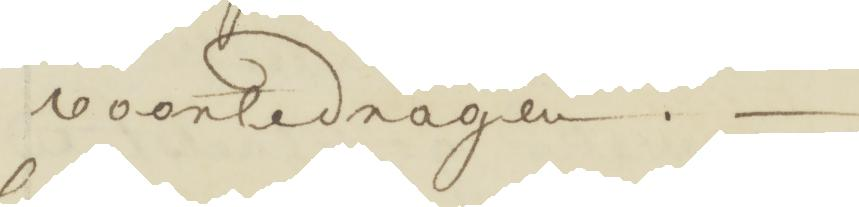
voor te dragen.-
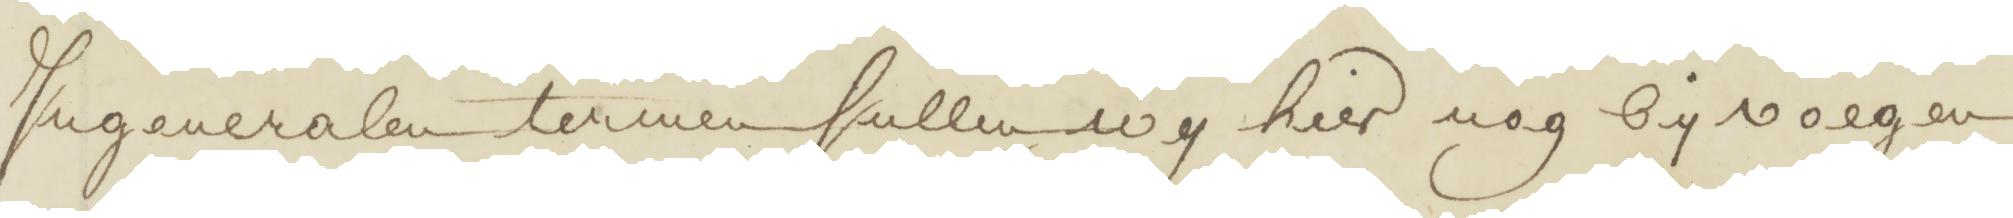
Jn generalen termen Sullen wij hier nog bij voegen,
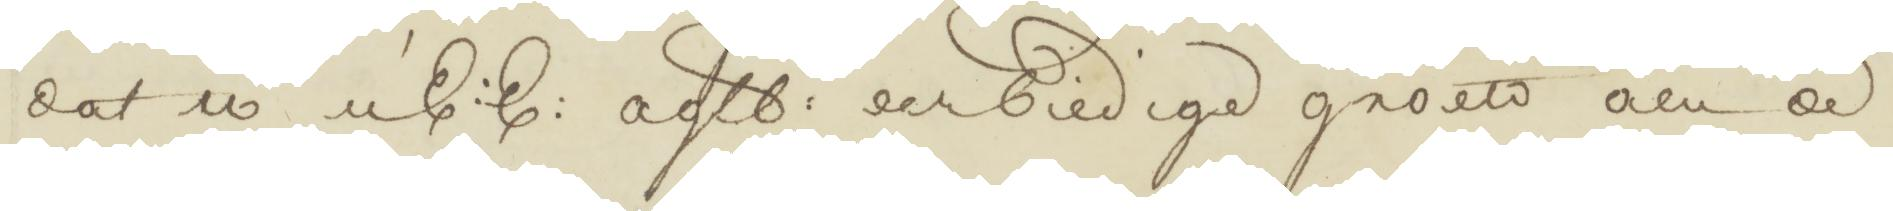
dat w' u E: E: agtb: eerbiedige groete aen de
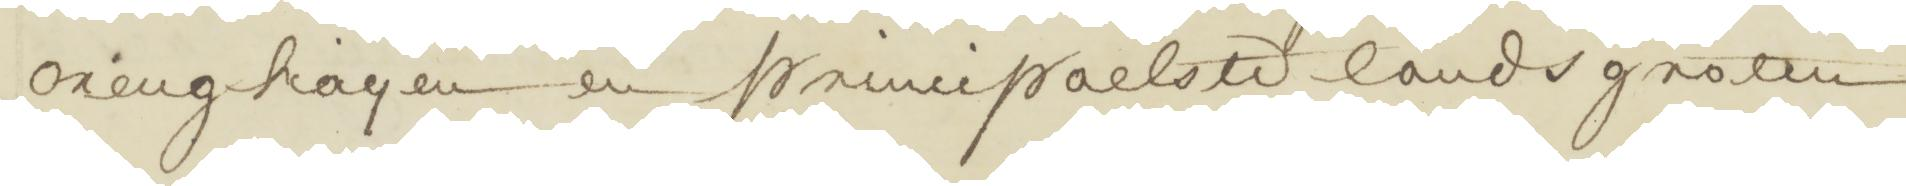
orengkaijen en principaelste lands groten
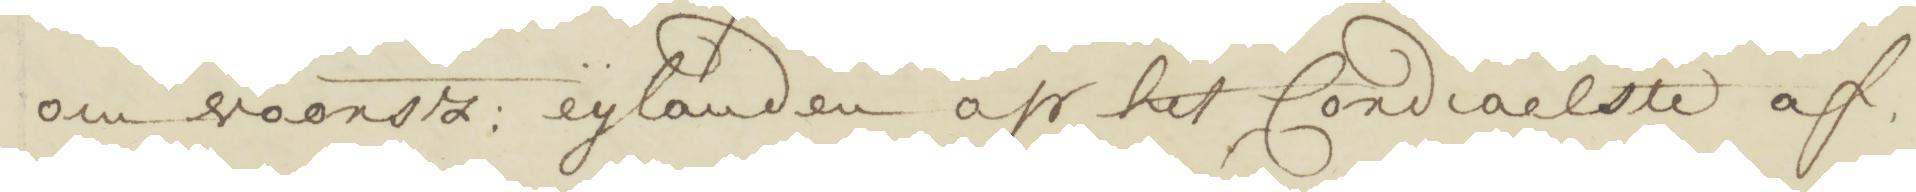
om voorsz: eijlanden op het Cordiaelste af„
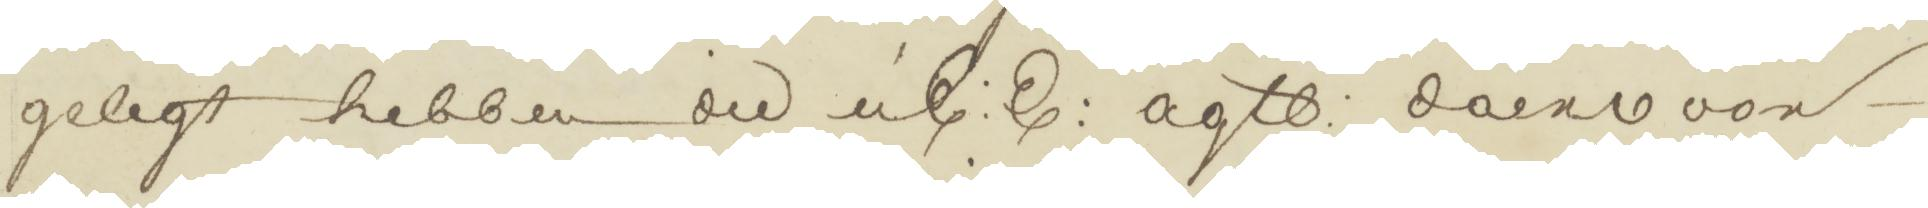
gelegt hebben die u E: E: agtb: daer voor
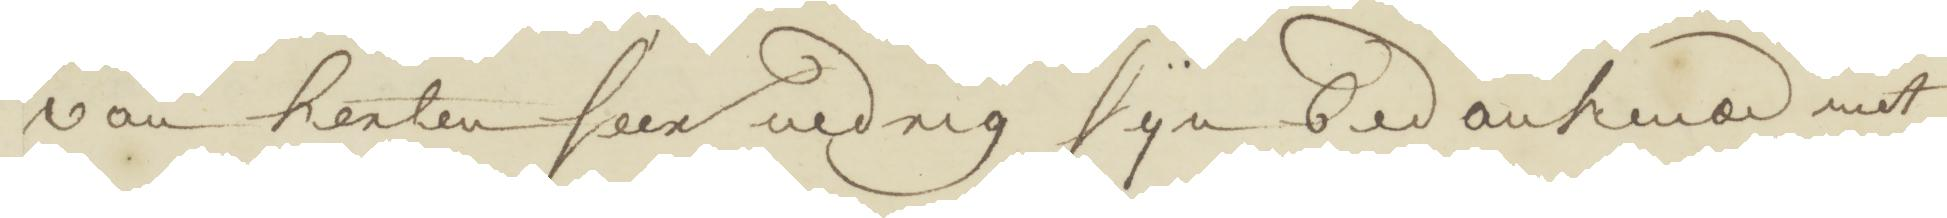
van herten Seer nedrig Sijn bedankende met
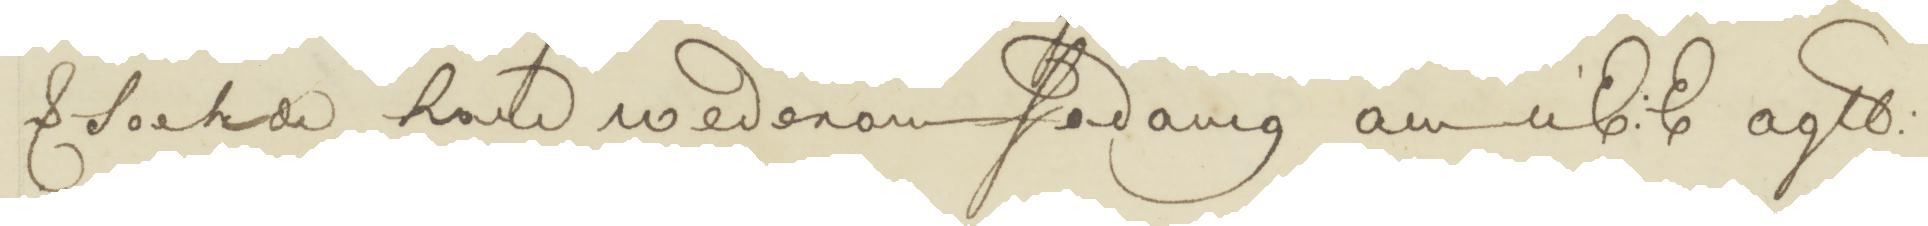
versoek de hare wederom Sodanig aen uE: E agtb:
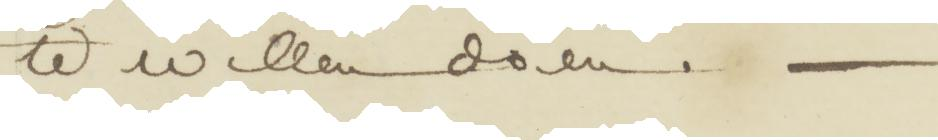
te willen doen.-
